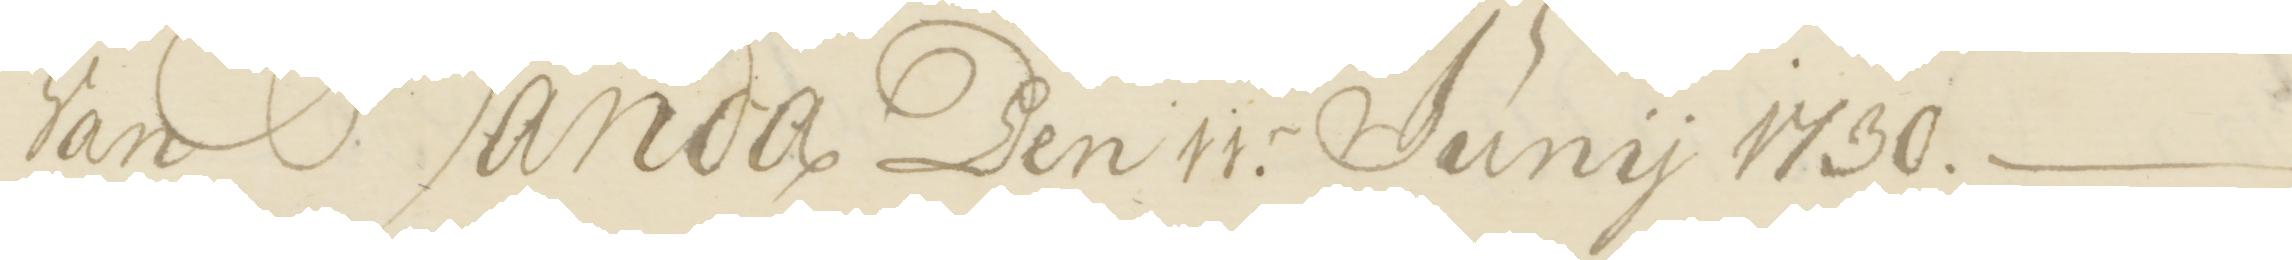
Van Banda Den 11:' Iunij 1730.-
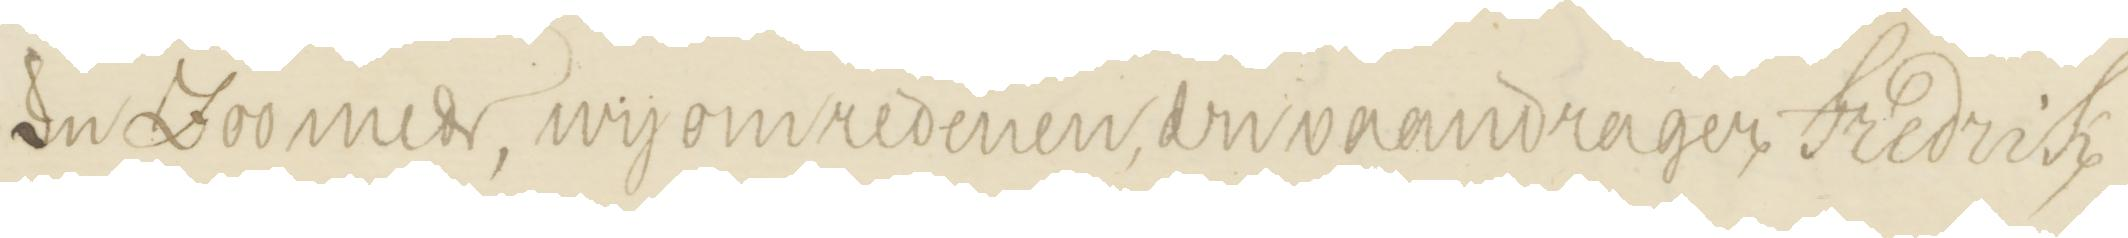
En Zoo mede, wij om redenen, den vaandrager fredrik
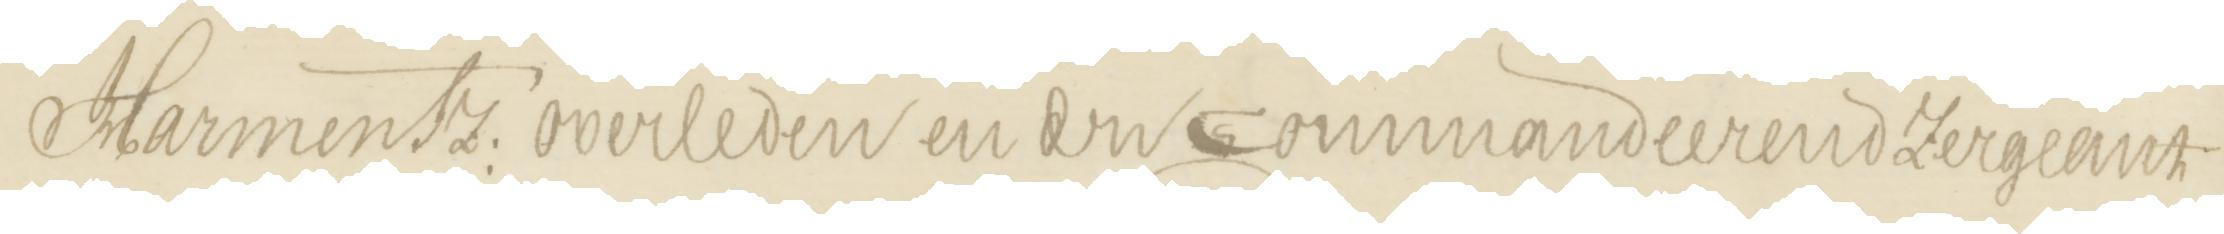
Harmensz: overleden en den commandeerend Zergeant
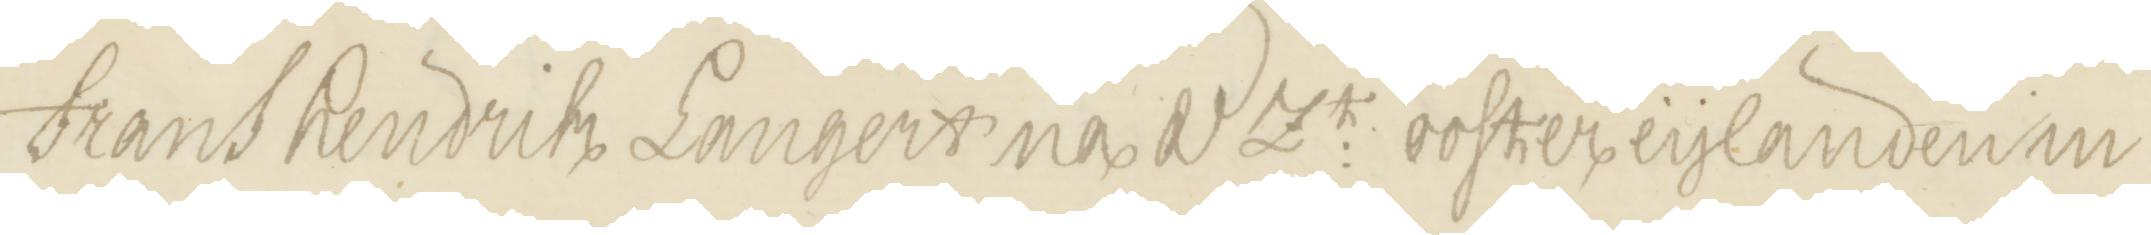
frans hendrik Langert na de Z:t ooster eijlanden in
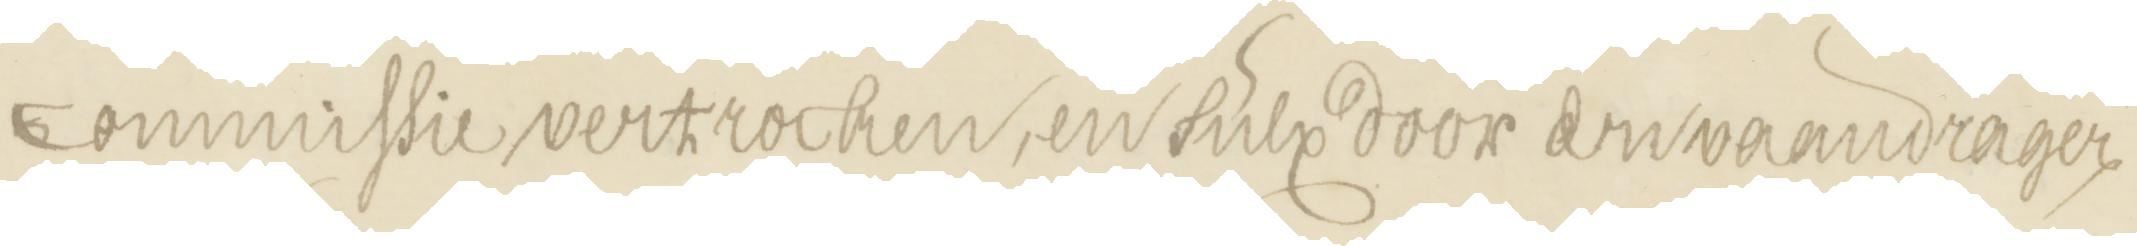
commissie vertrocken, en sulx door den vaandrager
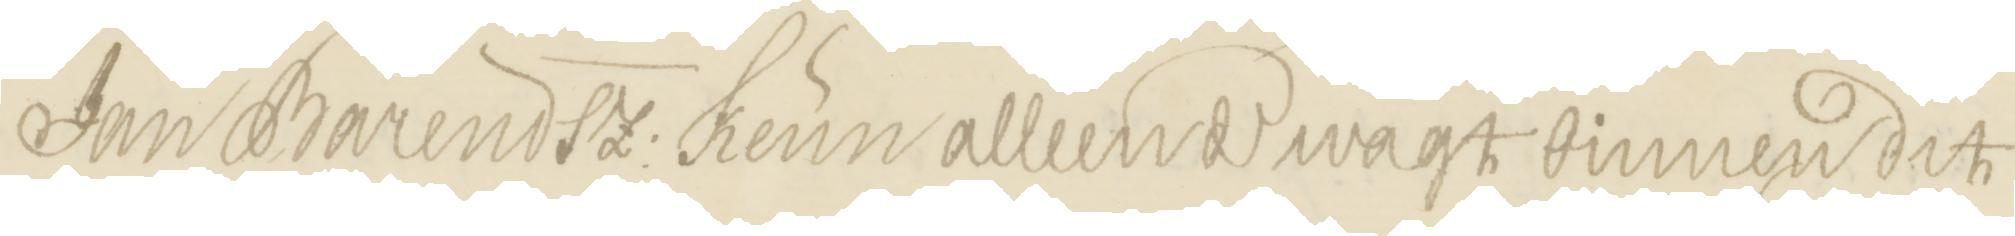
Ian Barendsz: keun alleen de wagt binnen dit
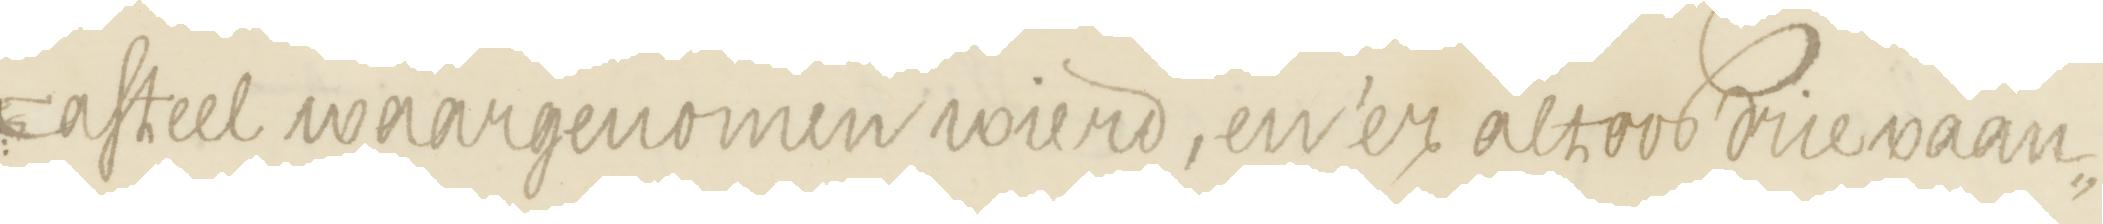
casteel waargenomen wierd, en 'er altoos drie vaan„
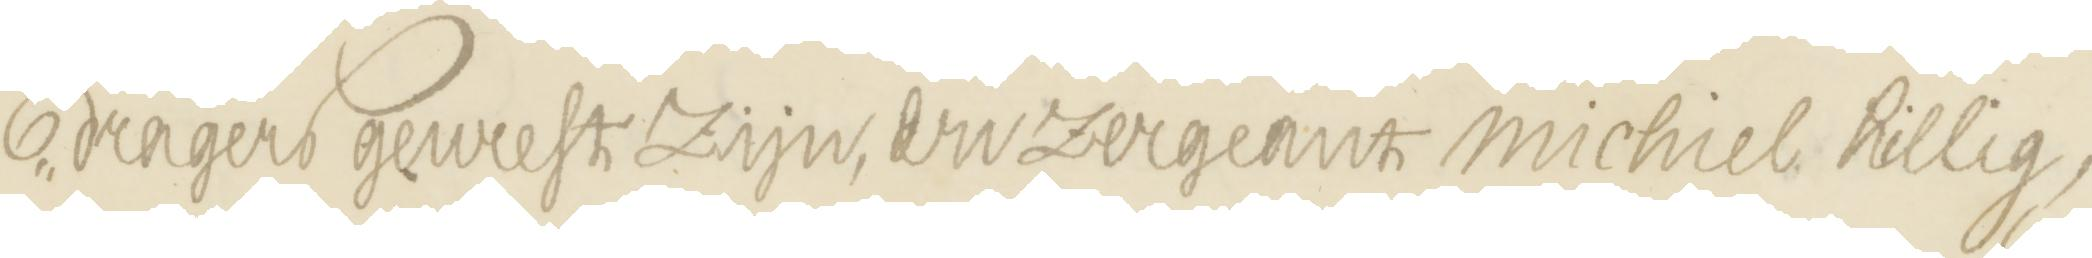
„dragers geweest Zijn, den zergeant michiel hillig,
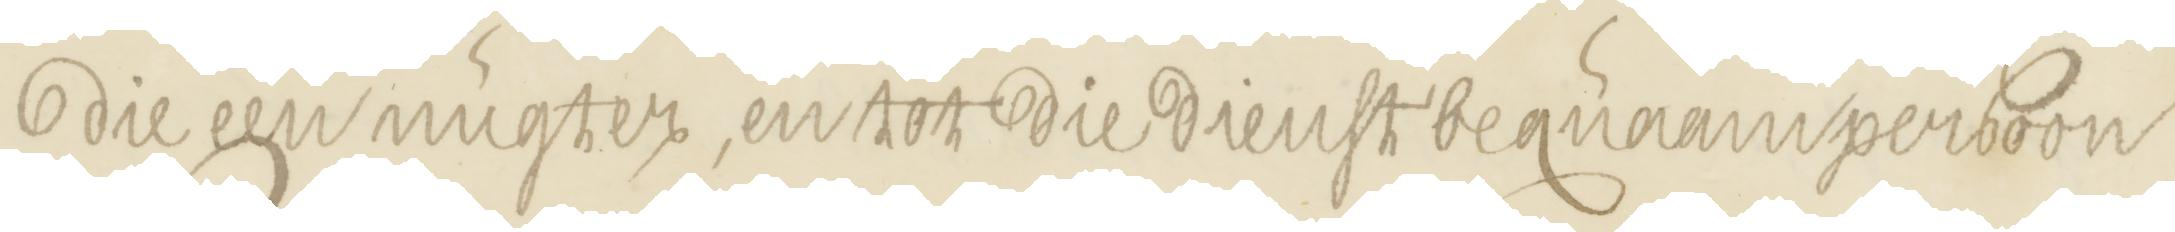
die een nugter, en tot die dienst bequaam persoon
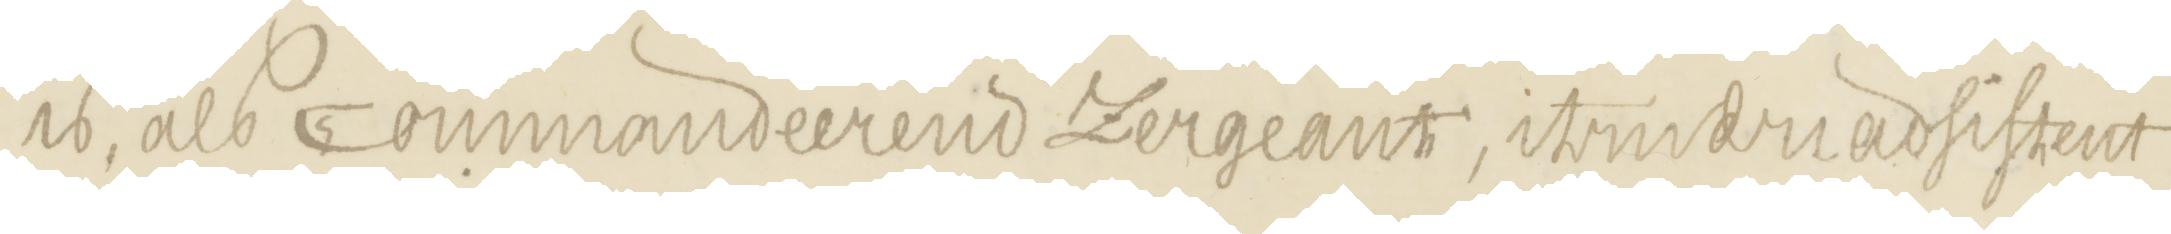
is, als commandeerend Zergeant, item den adsistent
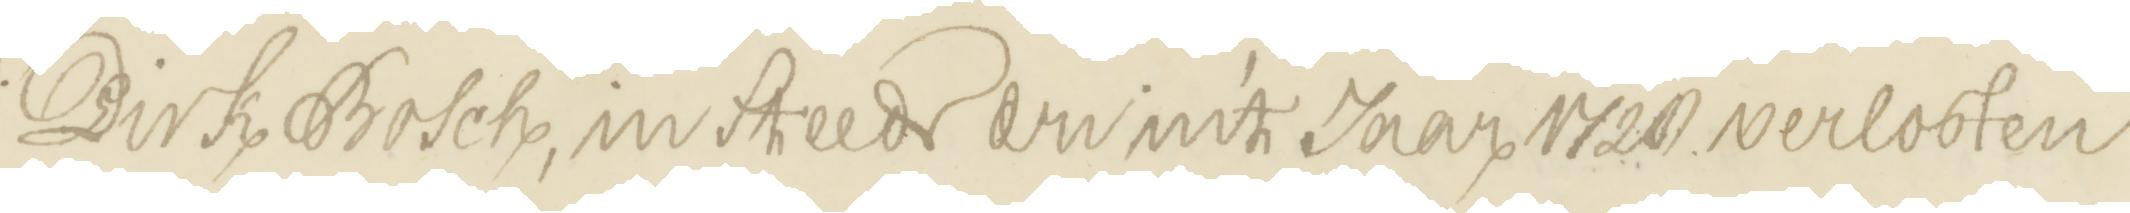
Dirk Bosch, in steede den in't Iaar 1728. verlosten
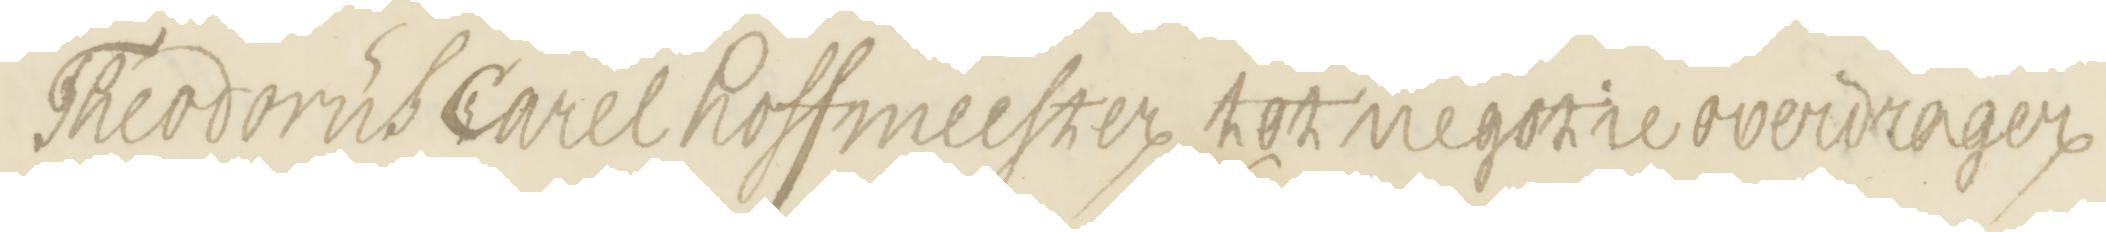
Theodorus Carel hoffmeester tot negotie overdrager
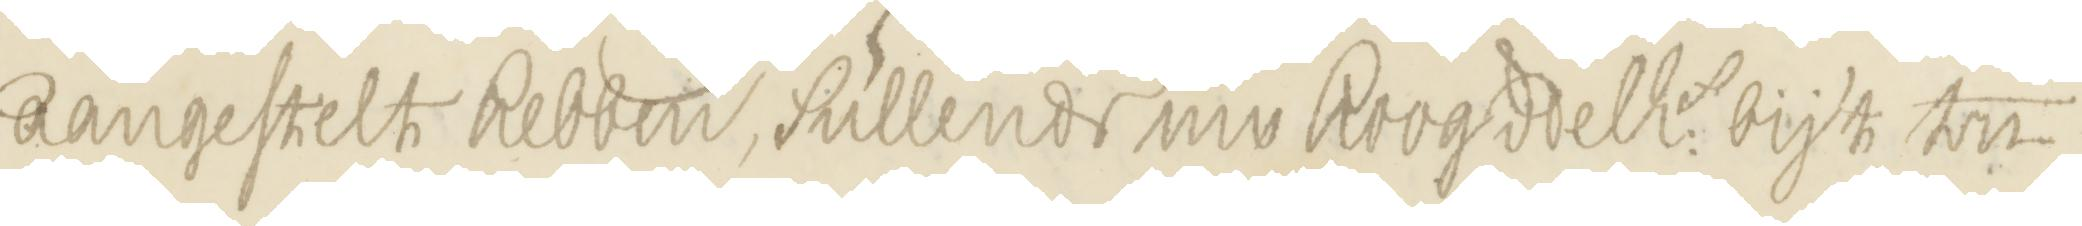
aangestelt hebben, Sullende uw hoog Edelh:s bij 't ten
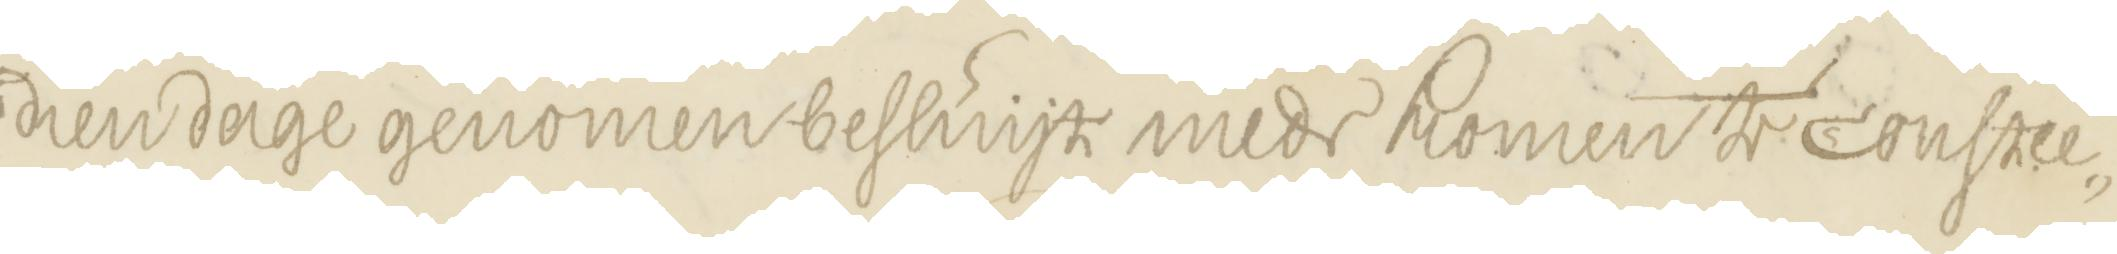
dien dage genomen besluijt mede komen te constee„
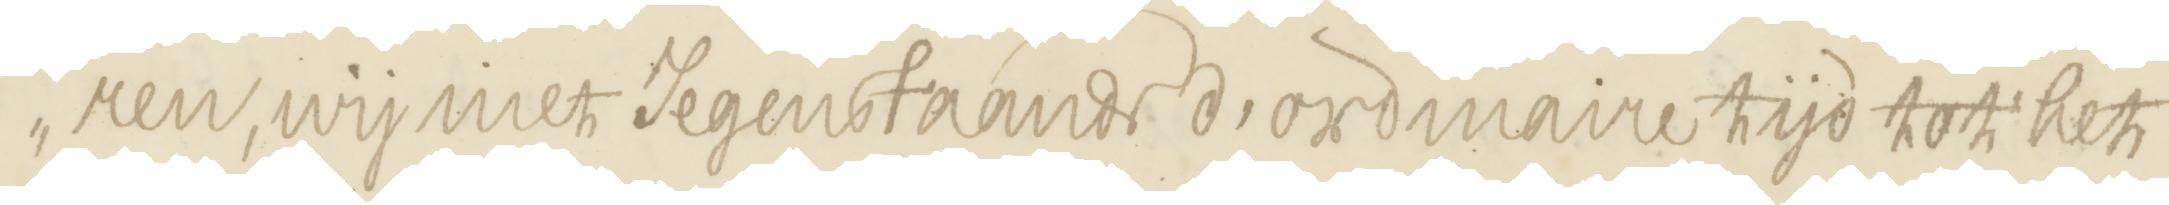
„ren, wij niet Iegenstaands d'ordinaire tijd tot het
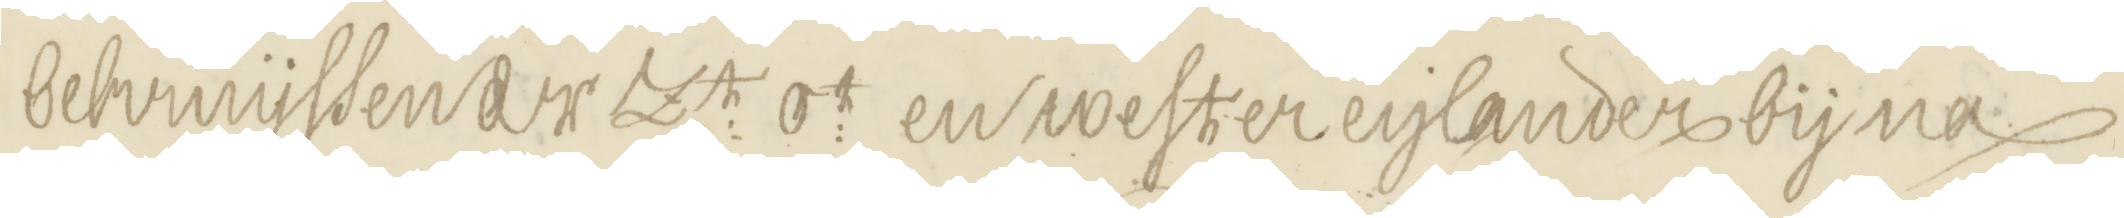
bekruijssen der Z:t O:t en wester eijlander bijna
